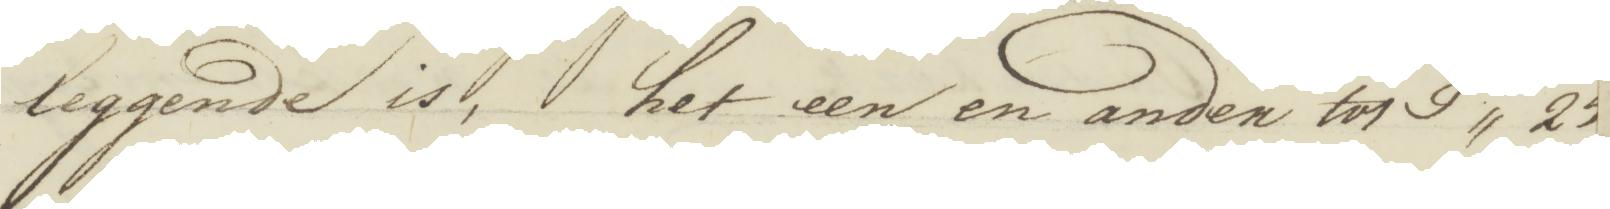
leggende is, het een en ander tot T„tr./. 25
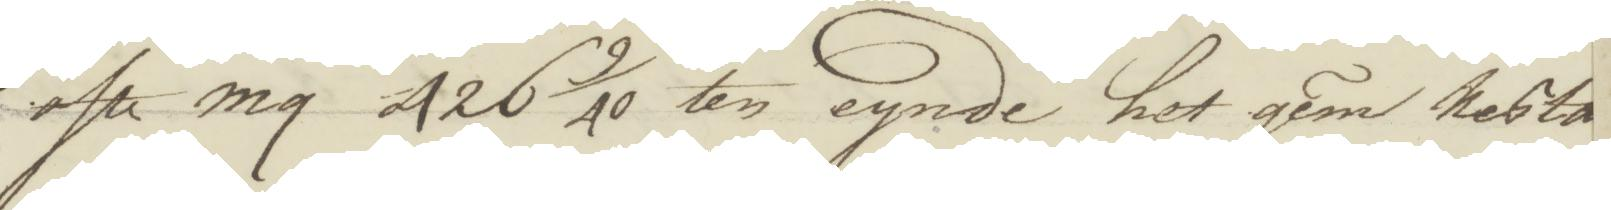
ofte mg 426 9/40 ten eynde het gem resta
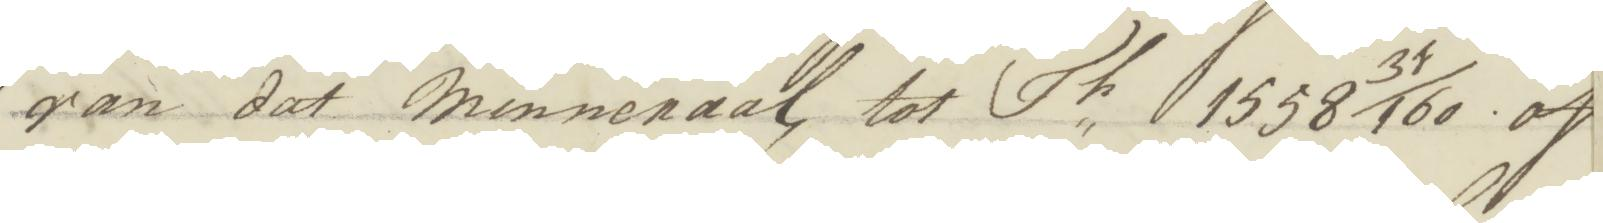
van dat minneraal tot T:h 1558 31/160: of
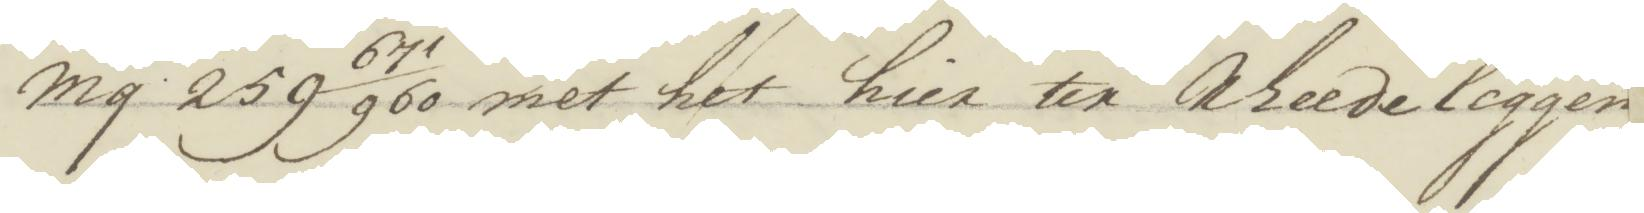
mg 259 671/960 met het hier ter Rheede leggen
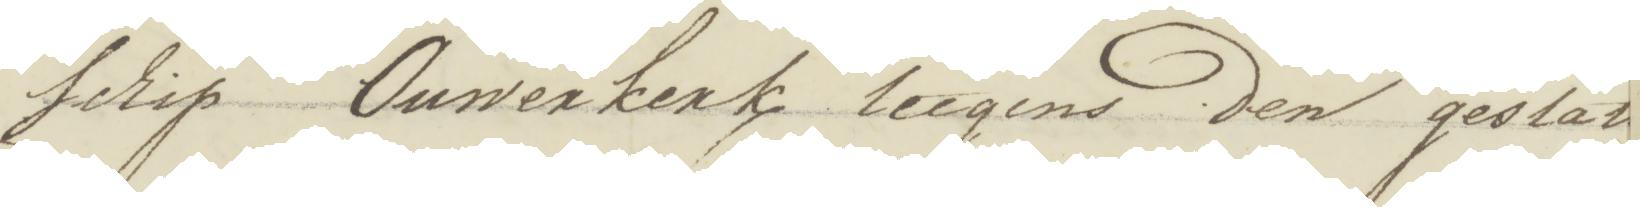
schip Ouwerkerk teegens den gestat
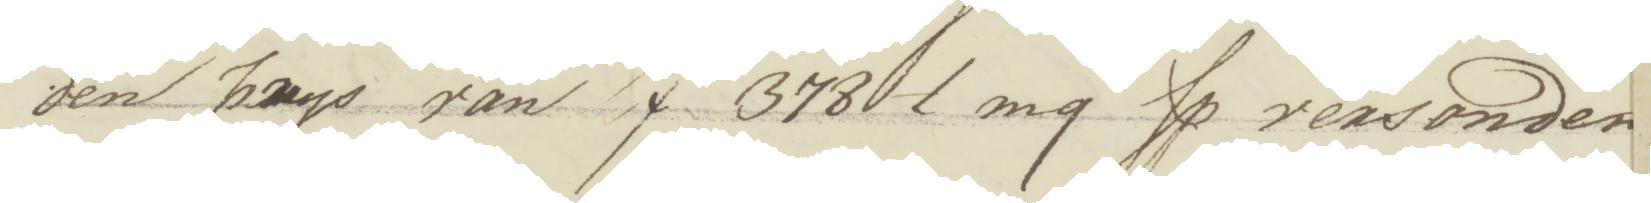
den prys van ƒ378 t mg fp op versonder
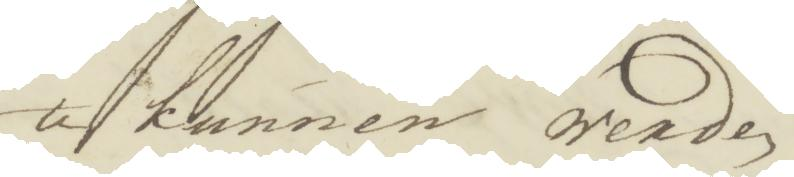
te kunnen werden
